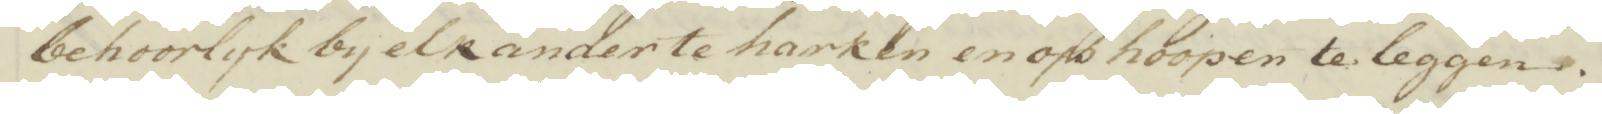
behoorlyk bij elkander te harken en op hoopen te leggen.
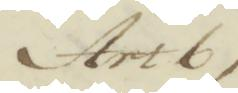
Art 6
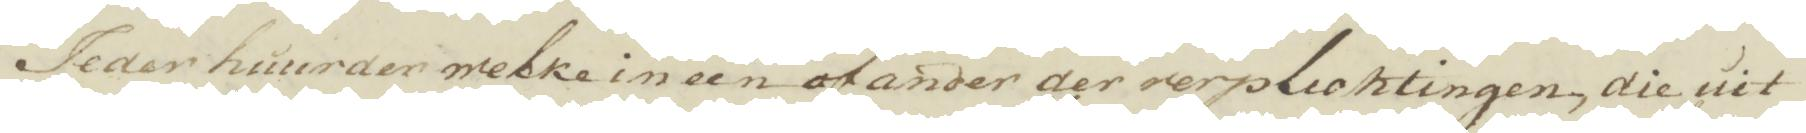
Jeder huurder welke in een of ander der verplichtingen, die uit
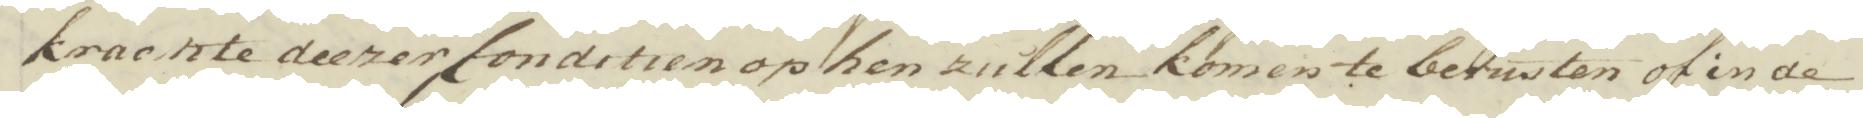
krachte deezer Conditien op hen zullen komen te berusten of in de
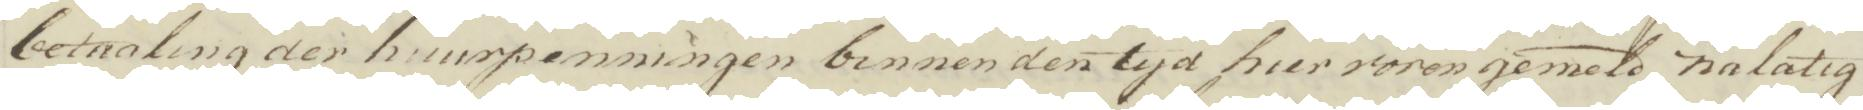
betaaling der huurpenningen binnen den tyd, hier voren gemeld, nalatig
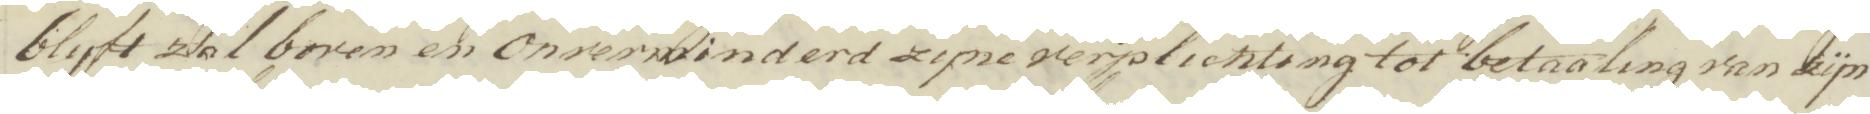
blyft zal boven en onverminderd zyne verplichting tot betaaling van zijn
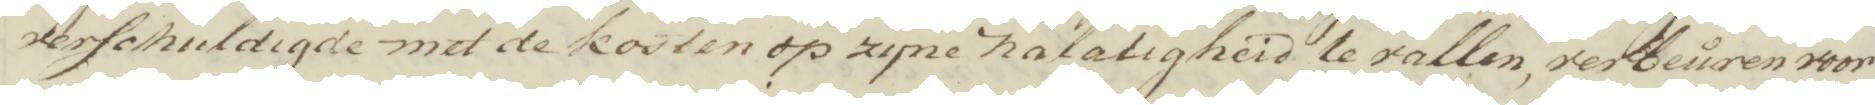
verschuldigde met de kosten op zyne nalatigheid te vallen, verbeuren voor
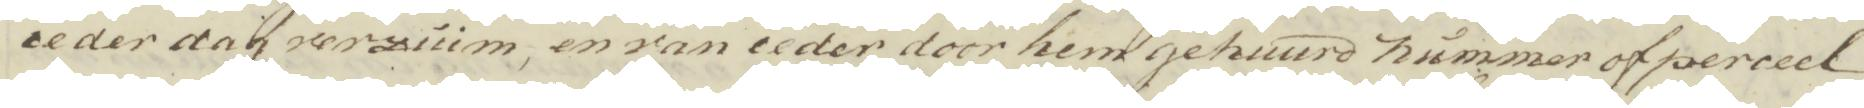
ieder dat verzuim, en van ieder door hem gehuurd nummer of perceel
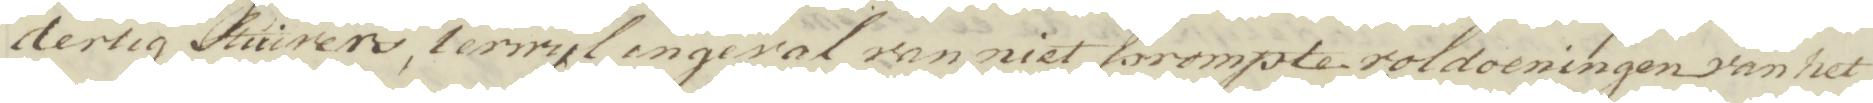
dertig stuivers, terwyl in geval van niet prompte voldoeningen van het
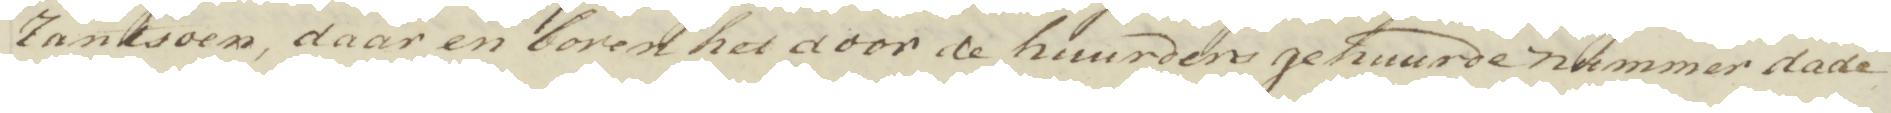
rantsoen, daar en boven het door de huurders gehuurde nummer dade
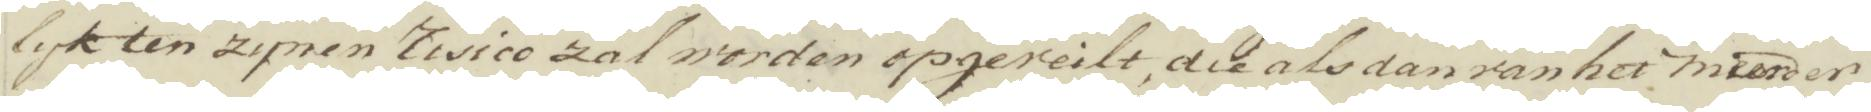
lyk ten zynen risico zal worden opgeveilt, die als dan van het meerder
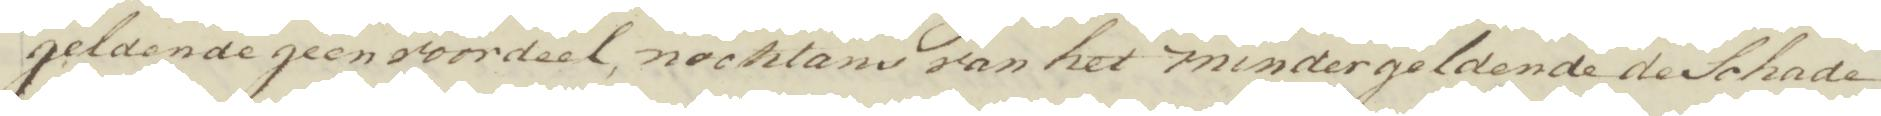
geldende geen voordeel, nochtans van het mindergeldende de schade
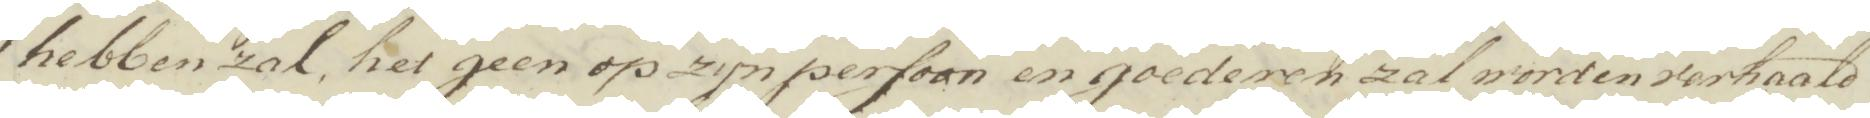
hebben zal, het geen op zyn persoon en goederen zal worden verhaald
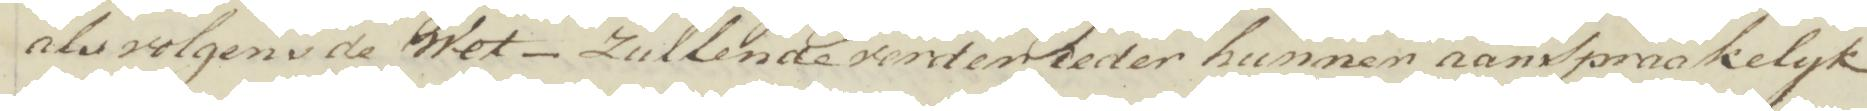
als volgens de wet – zullende verder ieder hunnen aanspraakelyk
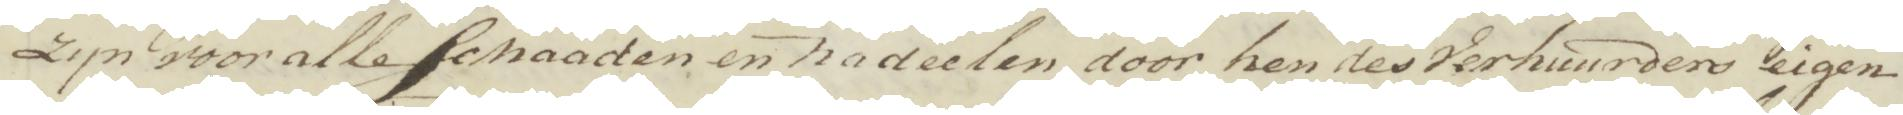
zyn voor alle schaaden en nadeelen door hen des verhuurders eigen
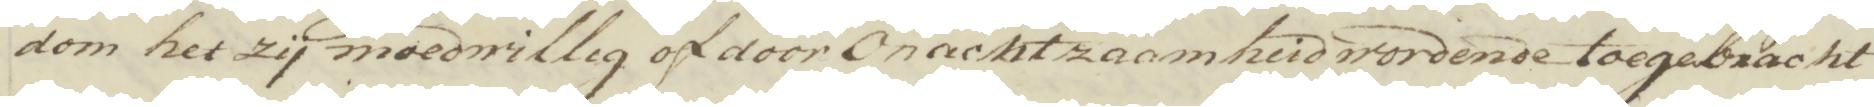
dom het zij moedwillig of door onachtzaamheid wordende toegebracht
